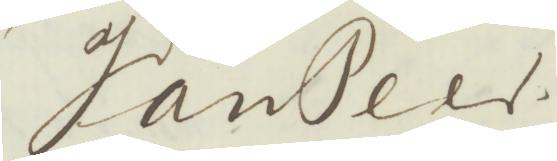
Van Peer.
